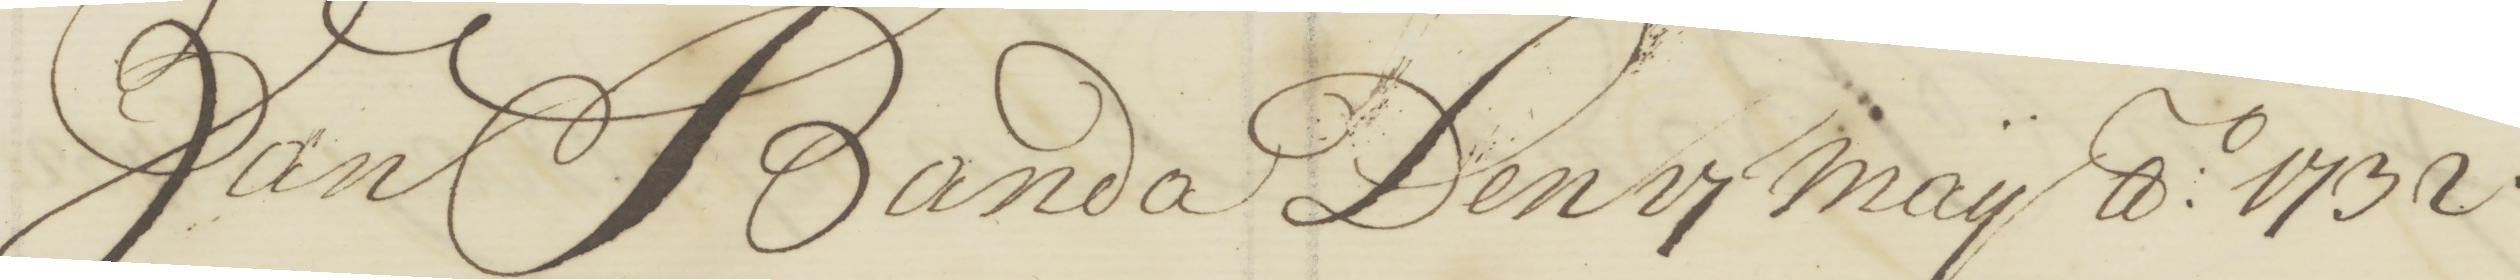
Van Banda Den 27 Maij lb:o 1732
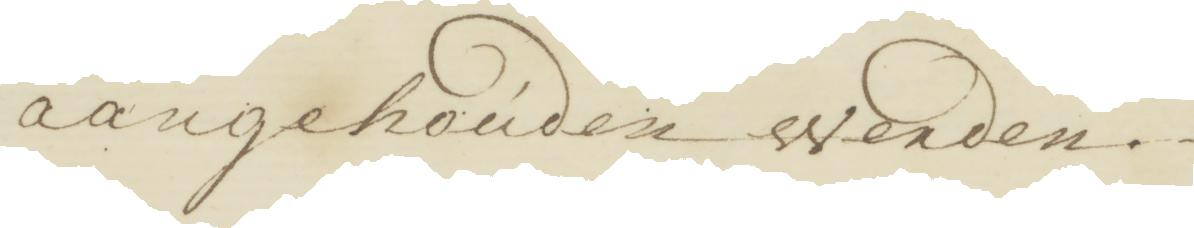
aangehouden werden.
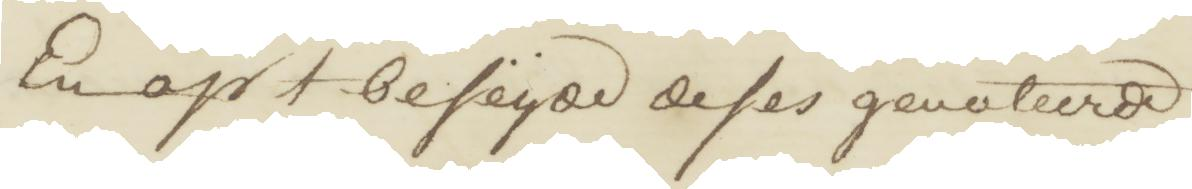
En op 't beseijde deses genoteerde
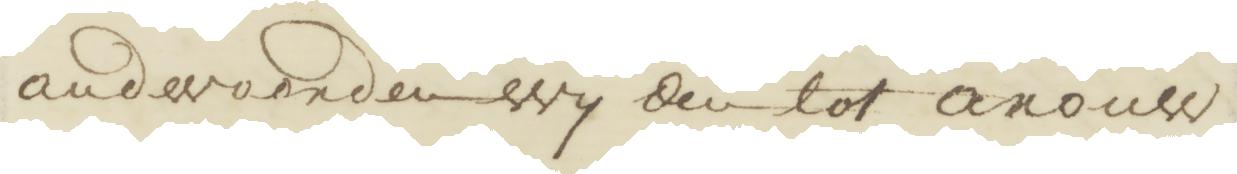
andwoorden wij den tot arouw
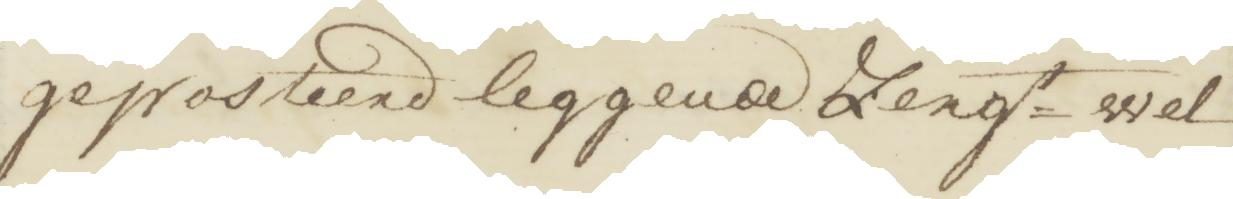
geposteerd leggende Zerg=t wel
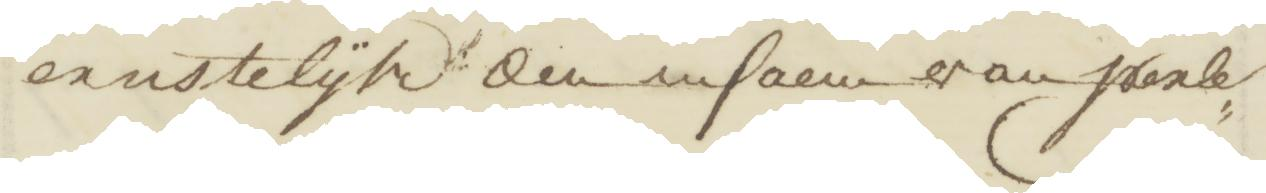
ernstelijk den insaem van perle„
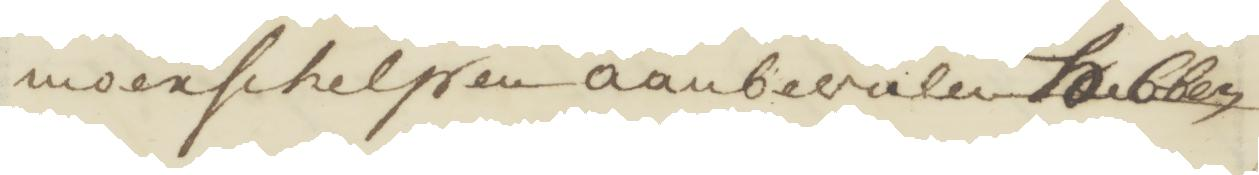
moerschelpen aanbevelen hebben
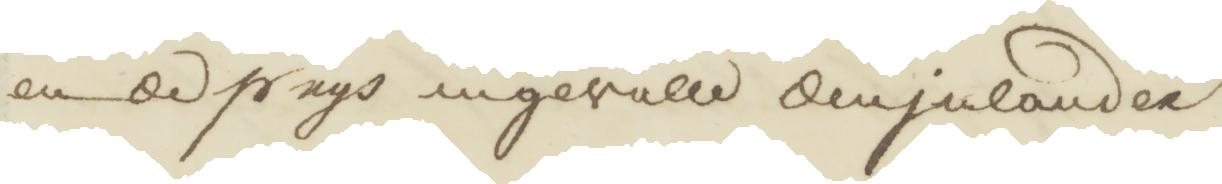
en de prys ingevalle den jnlander
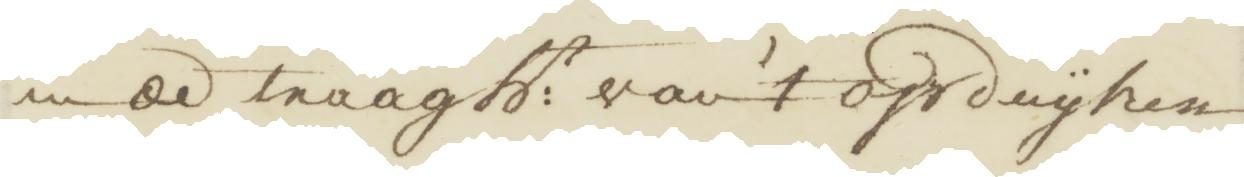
in de traagh:t van ’t opduijken
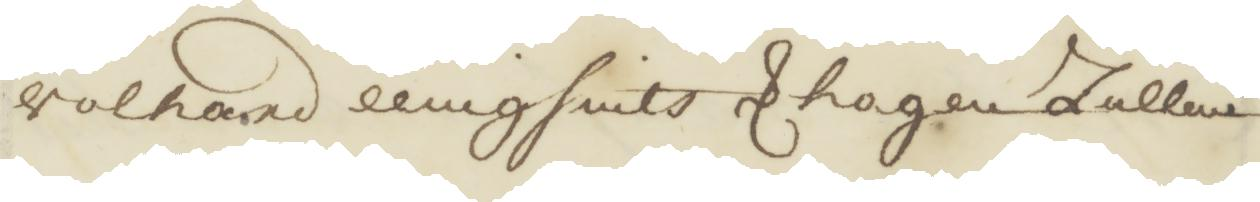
volhard eenigsints verhogen Zullen
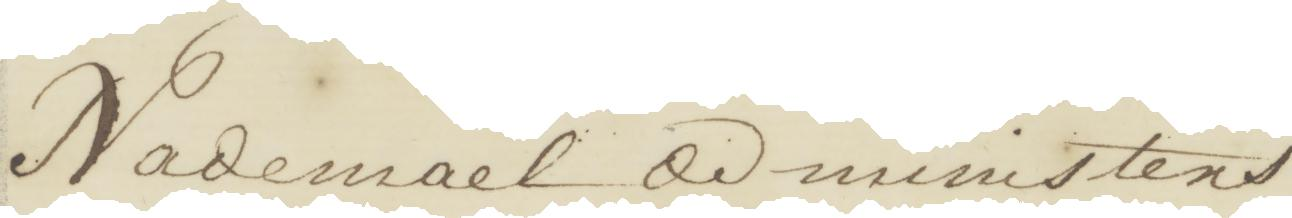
Nademael de ministers
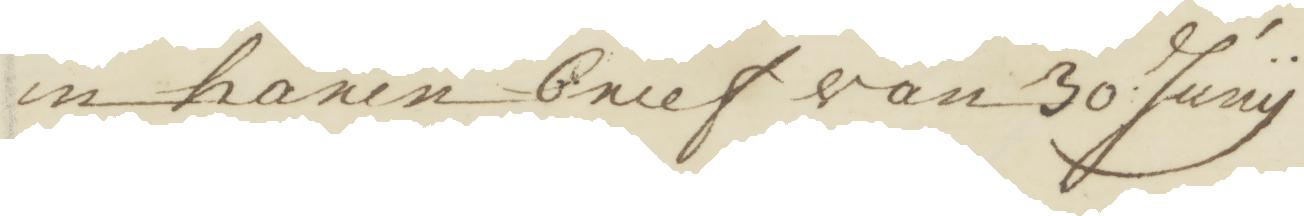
in haren brief van 30: Junij
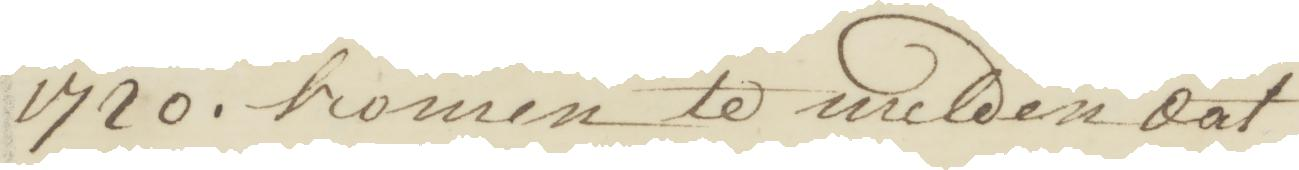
1720. komen te melden dat
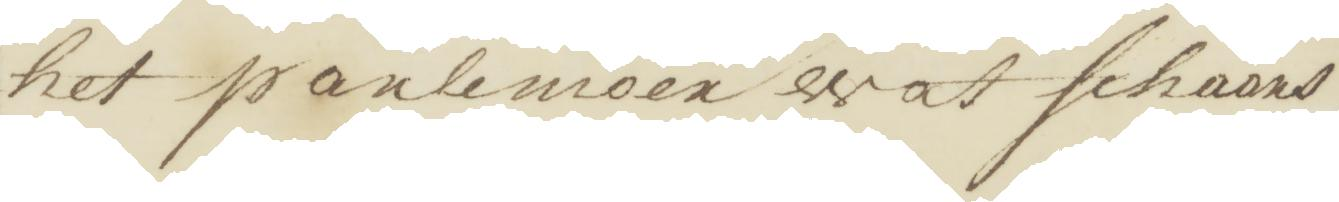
het parlemoer wat Schaars
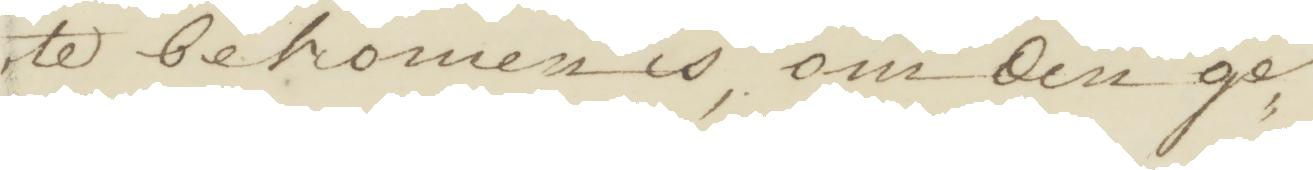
te bekomen is, om den ge„
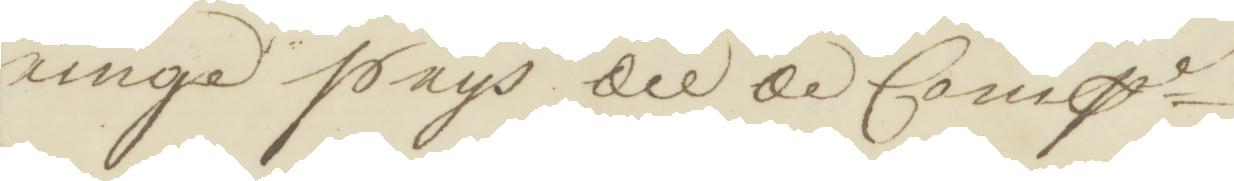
ringe prijs die de Comp=e
